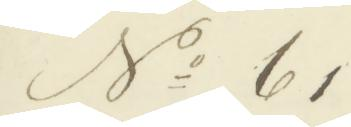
N=o 61
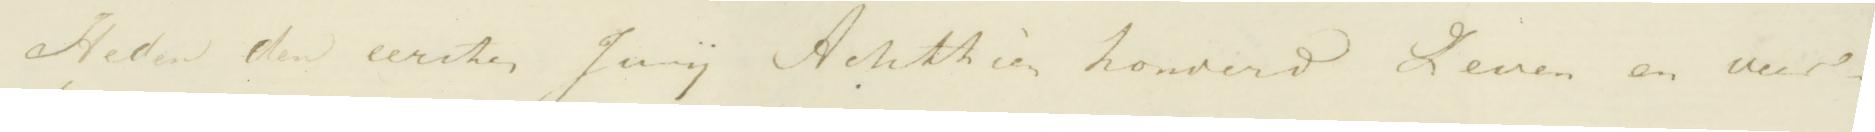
Heden den eersten Junij Achttien honderd Zeven en vier
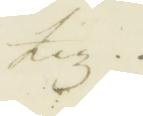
tig.
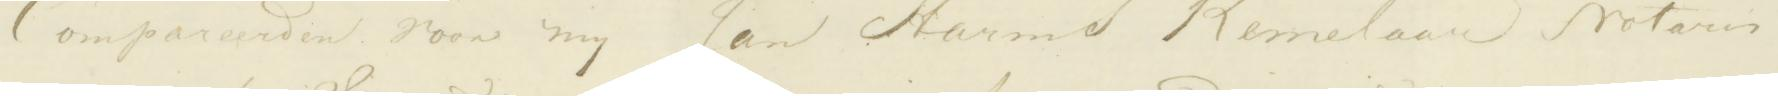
Compareerden voor mij Jan Harms Kemelaar Notaris
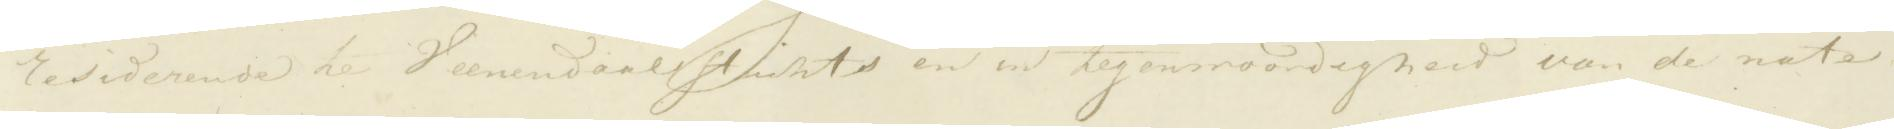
residerende te Veenendaal stichts en in tegenwoordigheid van de nate
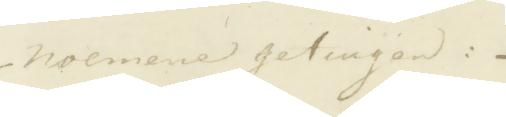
=noemene getuigen:
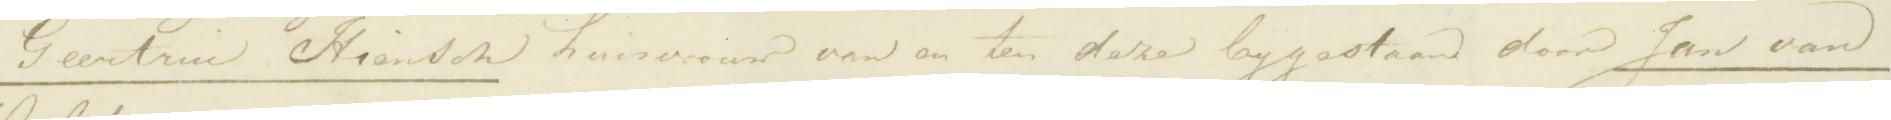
Geertrui Hiensch huisvrouw van en ten deze bijgestaand door Jan van
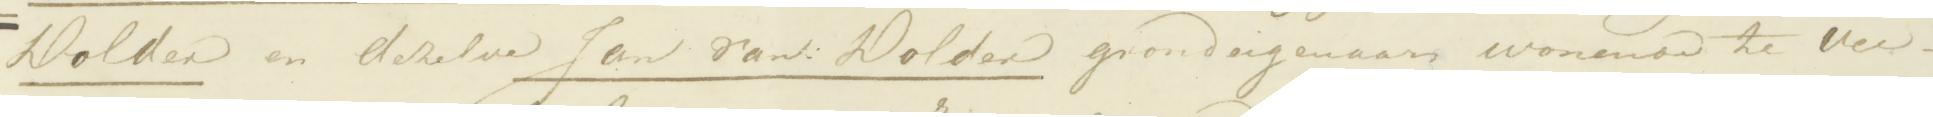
Dolder en dezelve Jan van Dolder grondeigenaar wonende te vee„
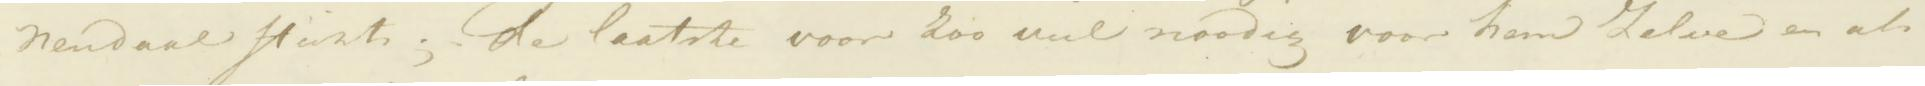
nendaal stichts; de laatste voor zoo veel noodig voor hem zelve en als
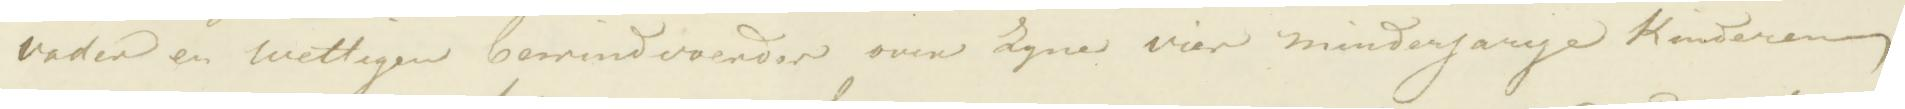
vader en wettigen bewindvoerder over zijne vier minderjarige kinderen
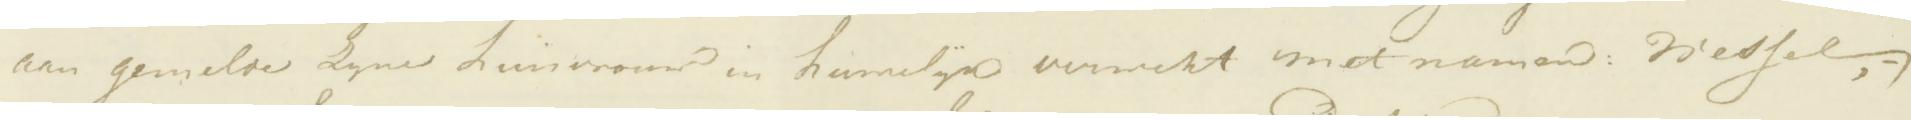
aan gemelde zijne huisvrouw in huwelijk verwekt met namen: Wessel,
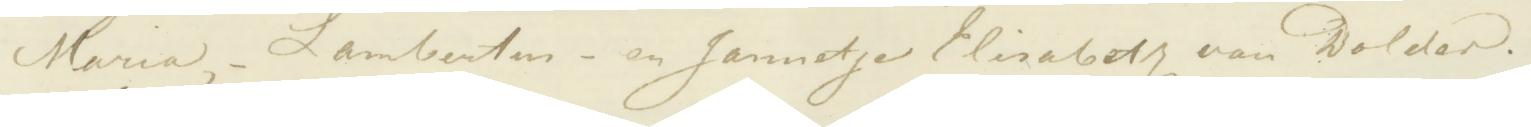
Maria, - Lambertus - en Jannetje Elisabeth van Dolder.
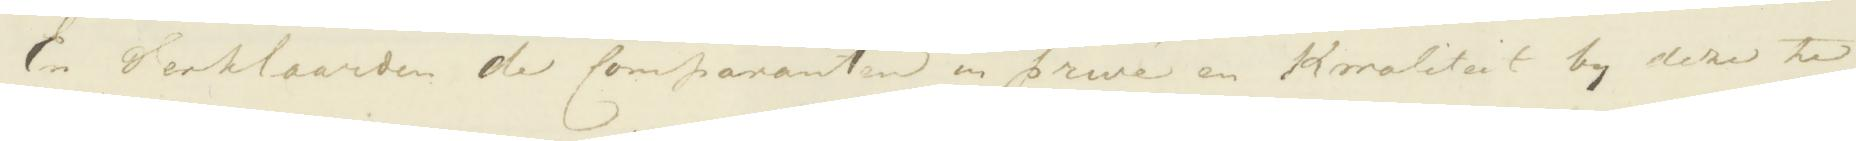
En verklaarden de Comparanten in privé en kwaliteit bij deze te
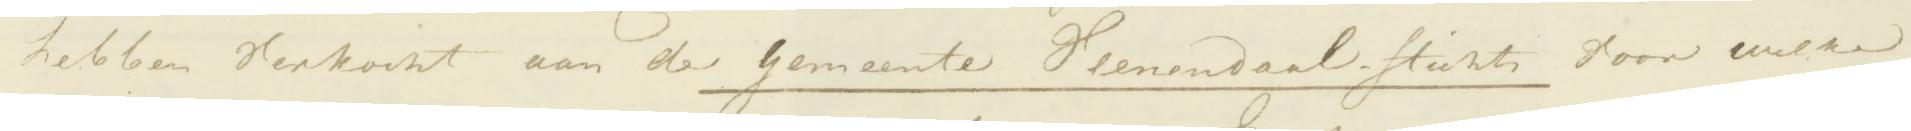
hebben verkocht aan de gemeente Veenendaal-stichts voor welke
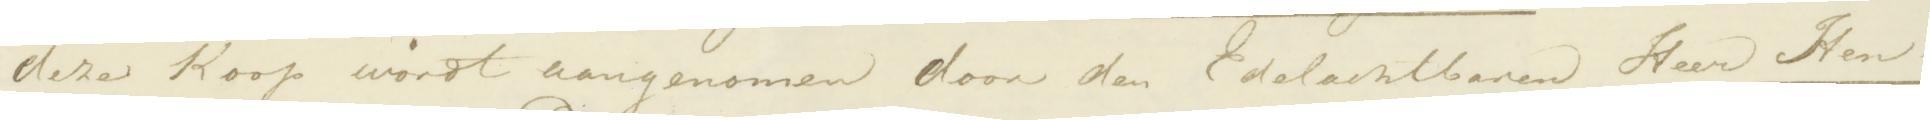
deze koop wordt aangenomen door den Edelachtbaren Heer Hen
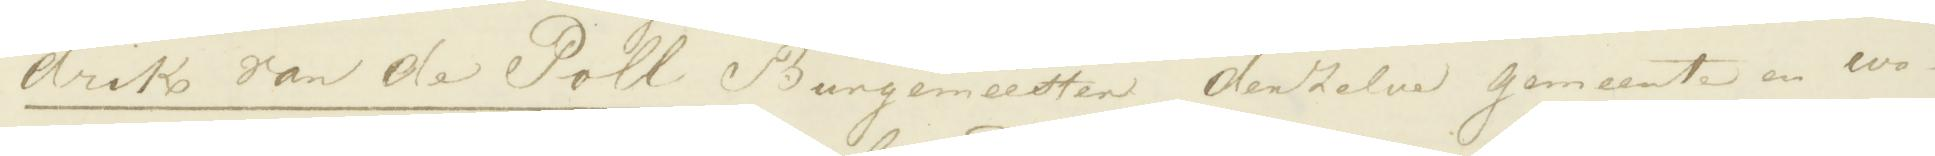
drik van de Poll Burgemeester denzelve gemeente en wo
